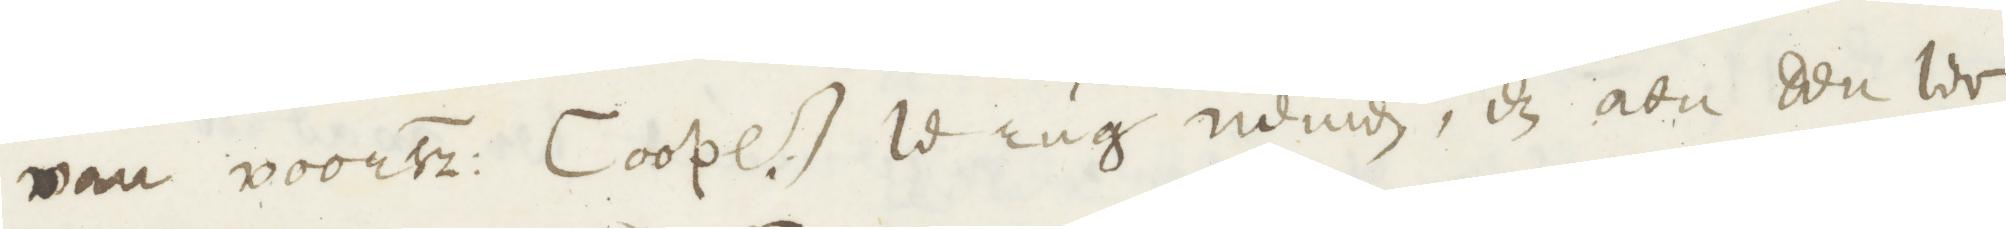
van voorsz: Coopl te rug nemen, en aen den ter
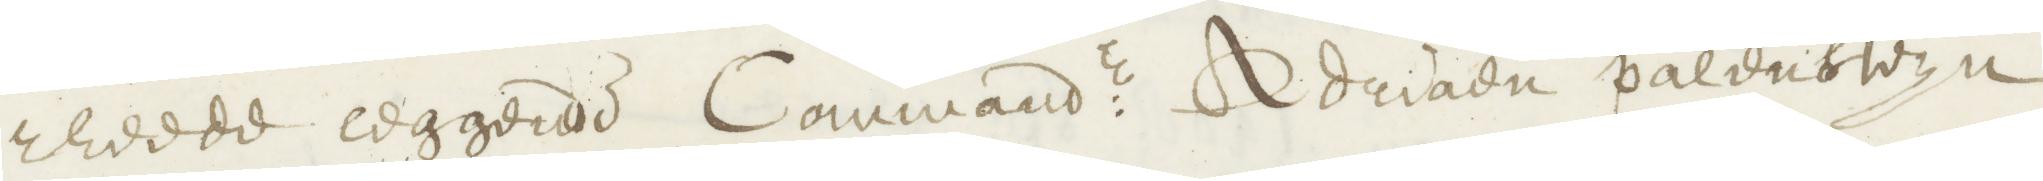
rheede leggende Command:r Adriaen palensteijn
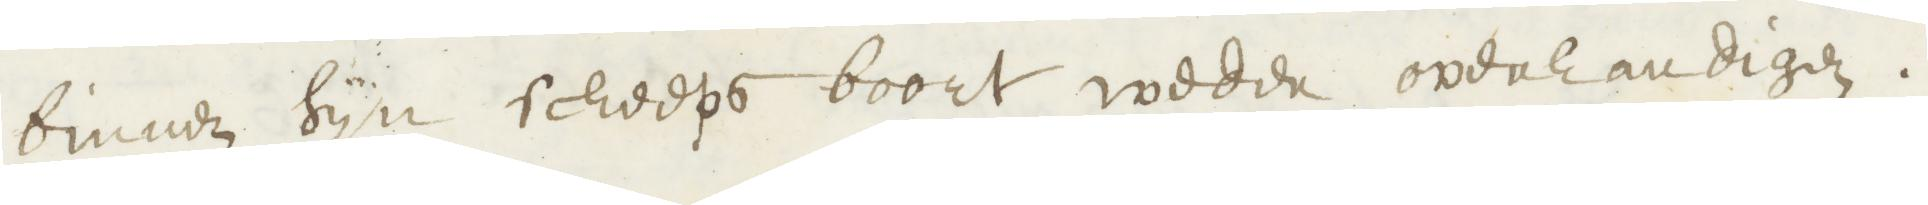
binnen sijn scheeps boort weder overhandigen.
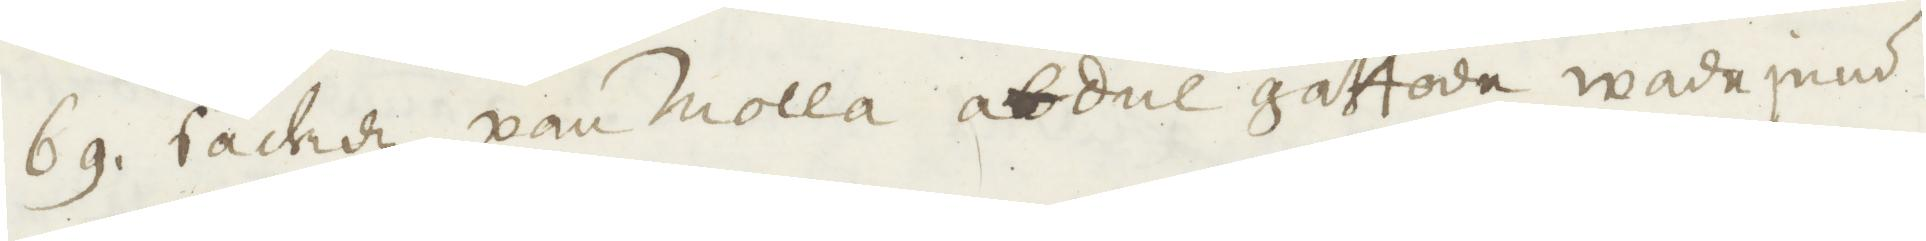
69. sacken van molla abdul gaffoer waer jnne
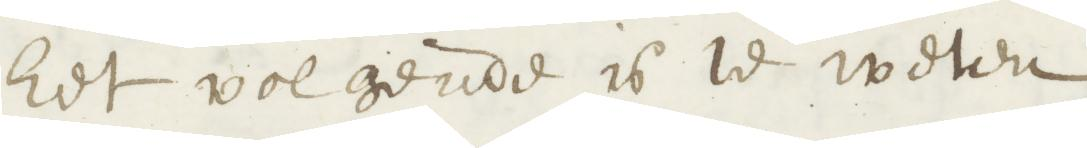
het volgende is te weten
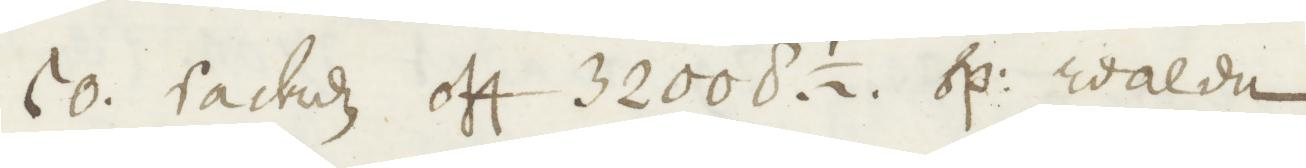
50. sacken off 32008.½. sp: realen
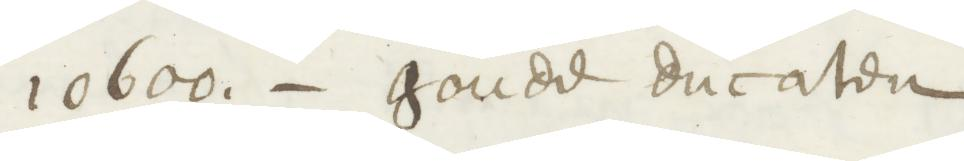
10600.- goude ducaten
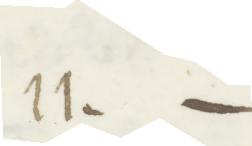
11. —
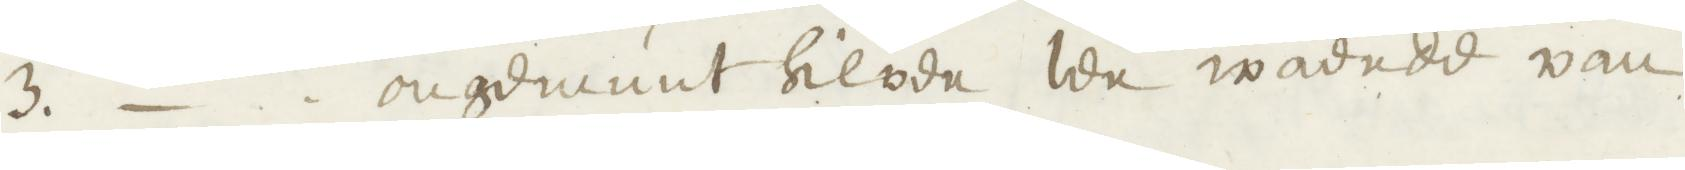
3. — - - ongemunt silver ter waerde van
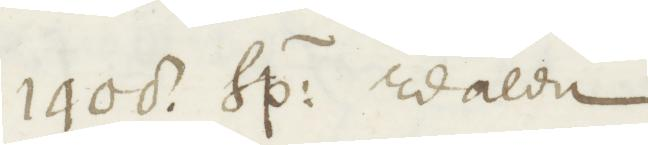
1408. sp: realen
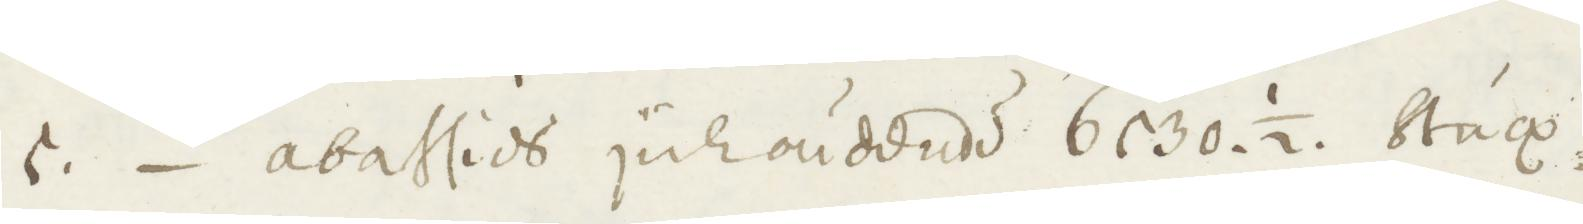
5. — abassies jnhoudende 6530.½. stucx
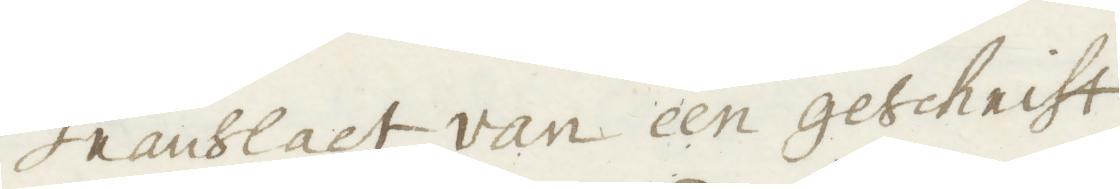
Translaet van een geschrift
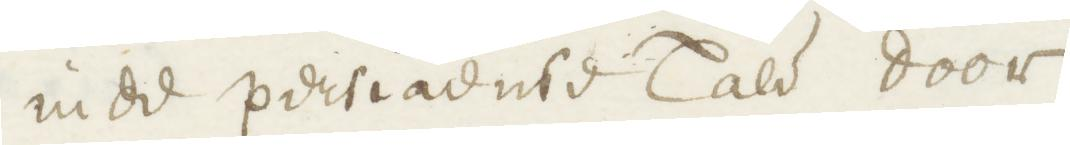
in de persiaense Tale door
